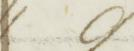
„ 9:
